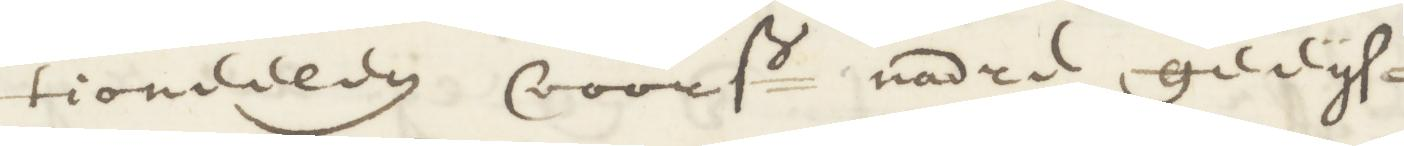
tioneelen voors=z nadre geeijsc
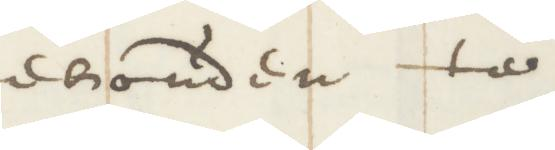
ehouden te
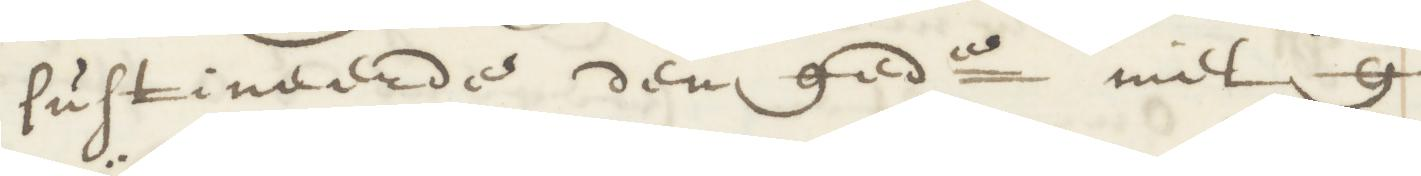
sustineerde den ged=e niet g
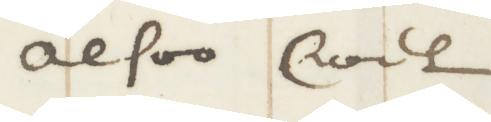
alsoo wel
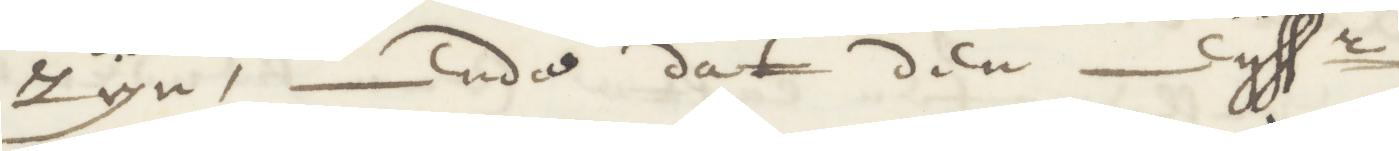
zijn, ende dat den eijss=r
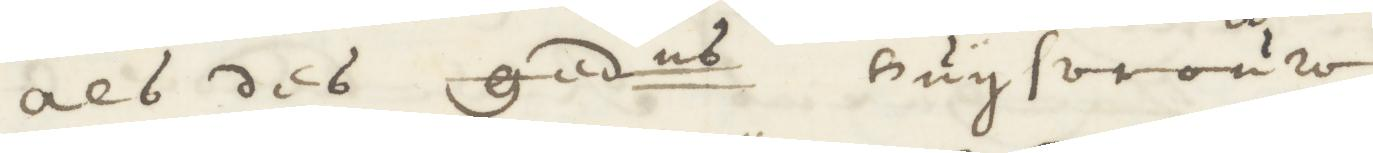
als des ged=ns huijsvrouw
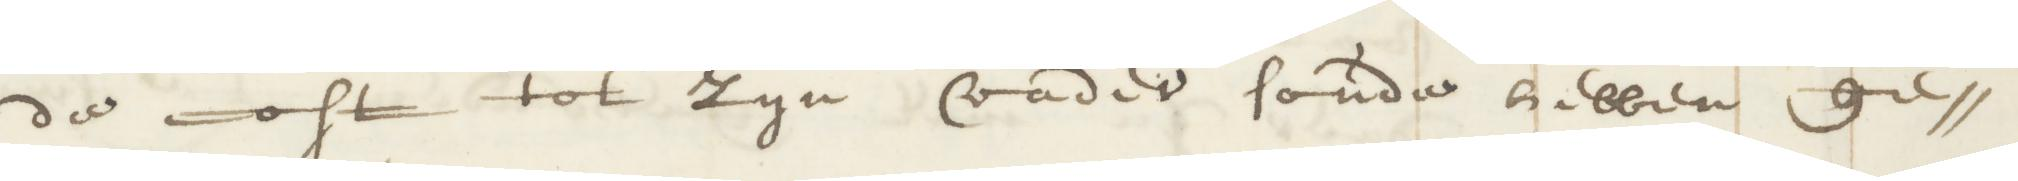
de cost tot zijn vader soude hebben ge„
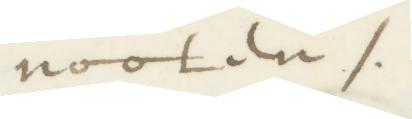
nooten/.
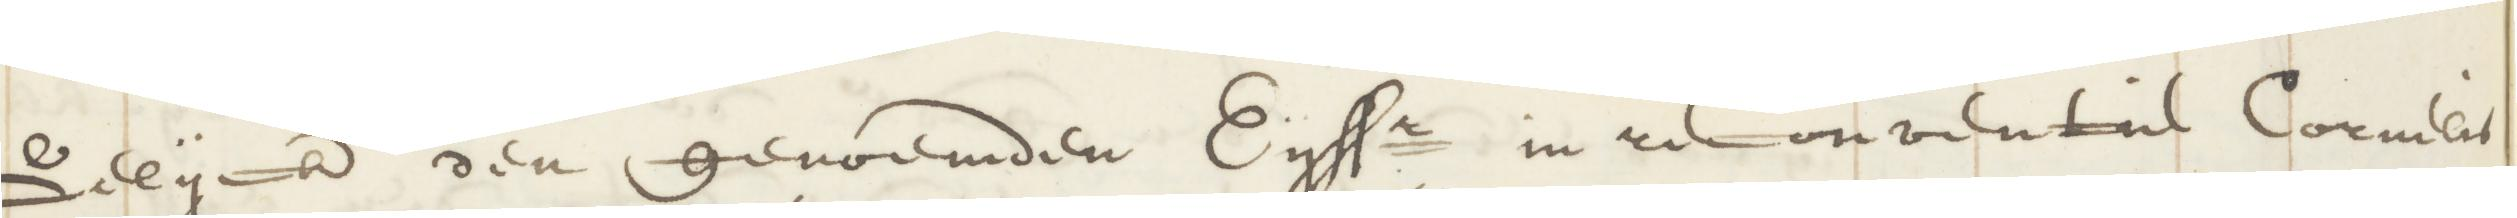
Gelijck den genoemden Eijss=r in reconventie Cornelis
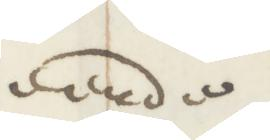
eerde
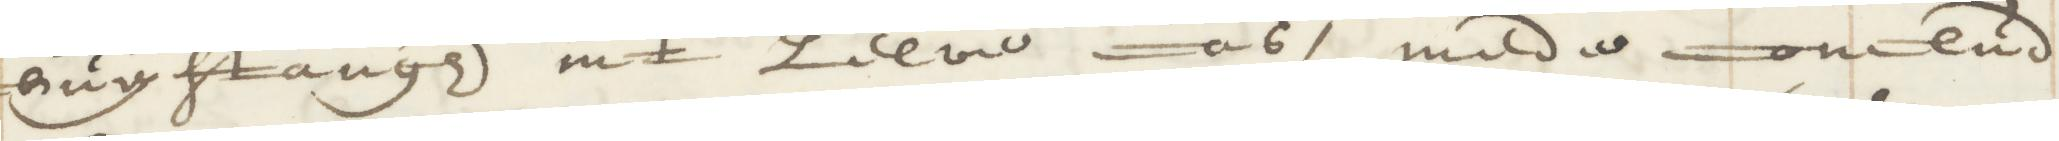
huijftangh in t zelve cas, mede conclud
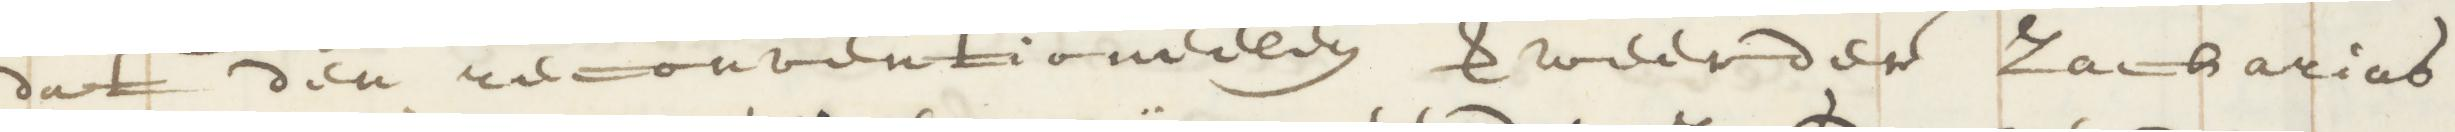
dat den reconventioneelen verweerder Zacharias
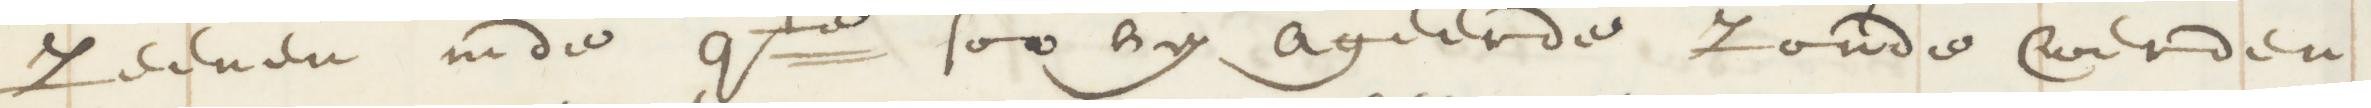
Zeeren in de q=te soo hij ageerde zoude werden
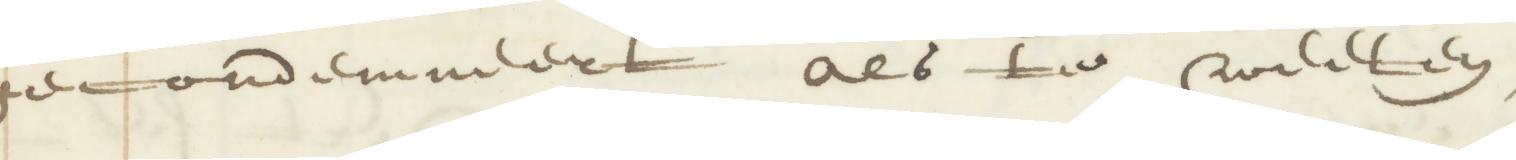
econdemneert als te weeten
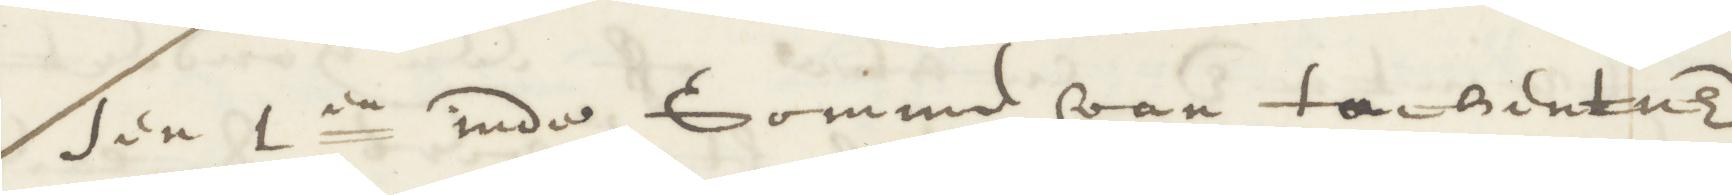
Ten 1=en inde Somme van tachentich
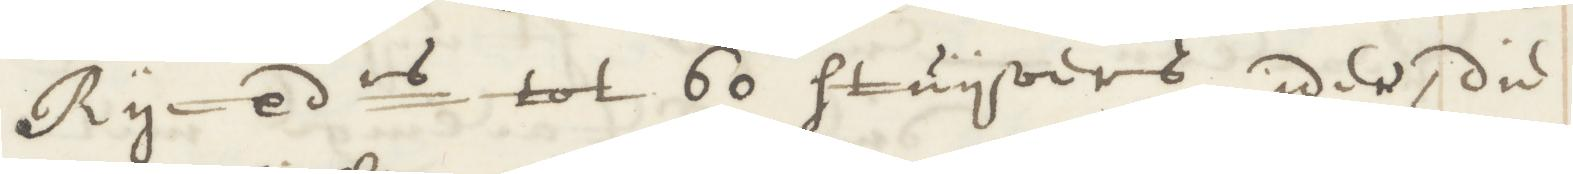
Rijcxs=rs tot 60 stuijvers ider, die
